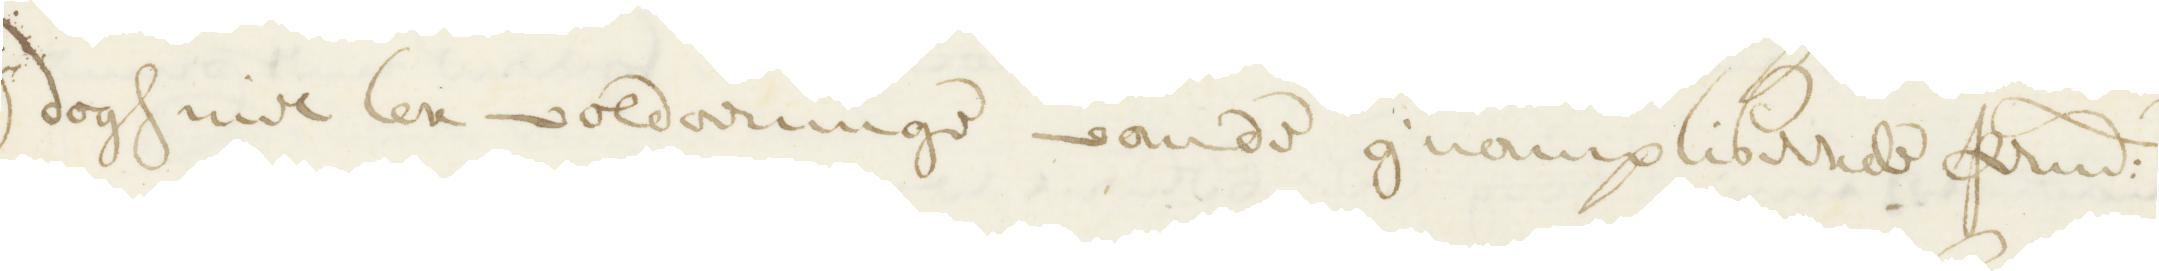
dogh niet ter voldoeninge van de g’namptiseerde penn:
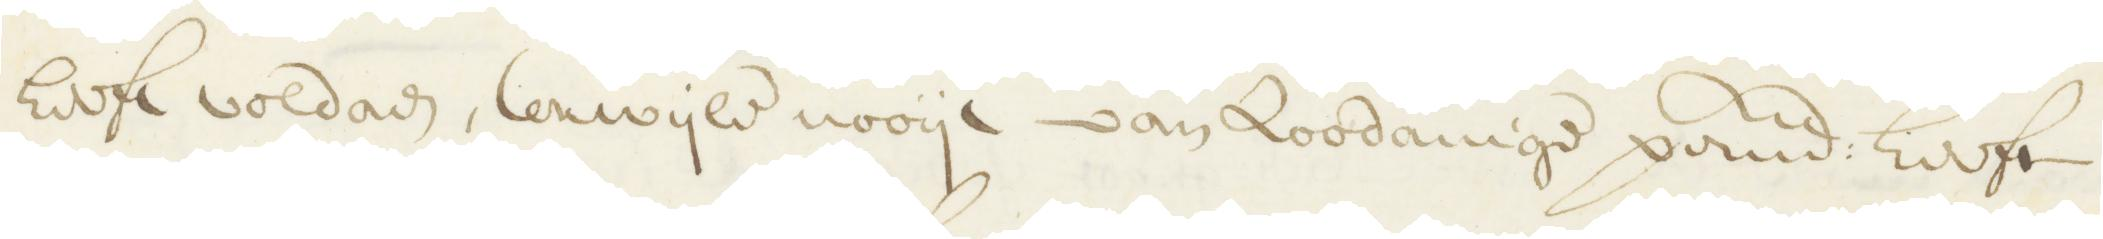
heeft voldaen, terwijle nooijt van zoodanige penn: heeft
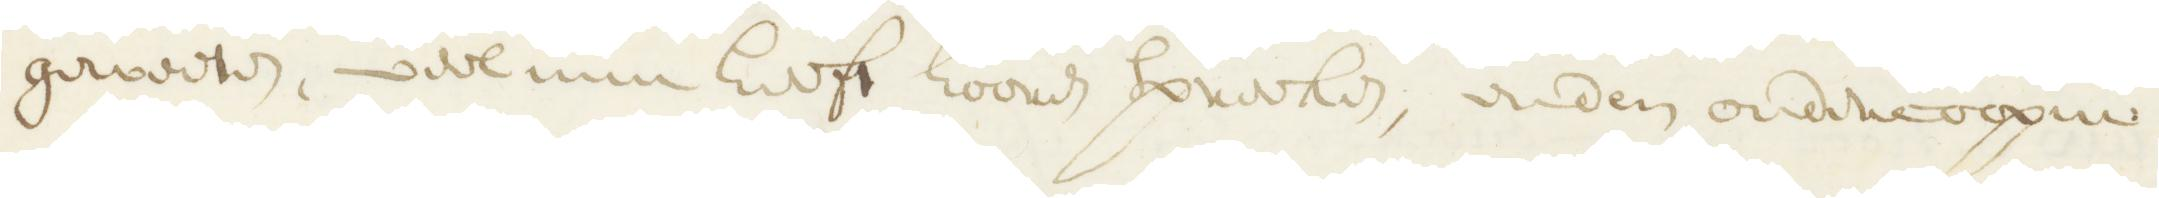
geweeten, veel min heeft hooren spreeken; en den ondercoopm:
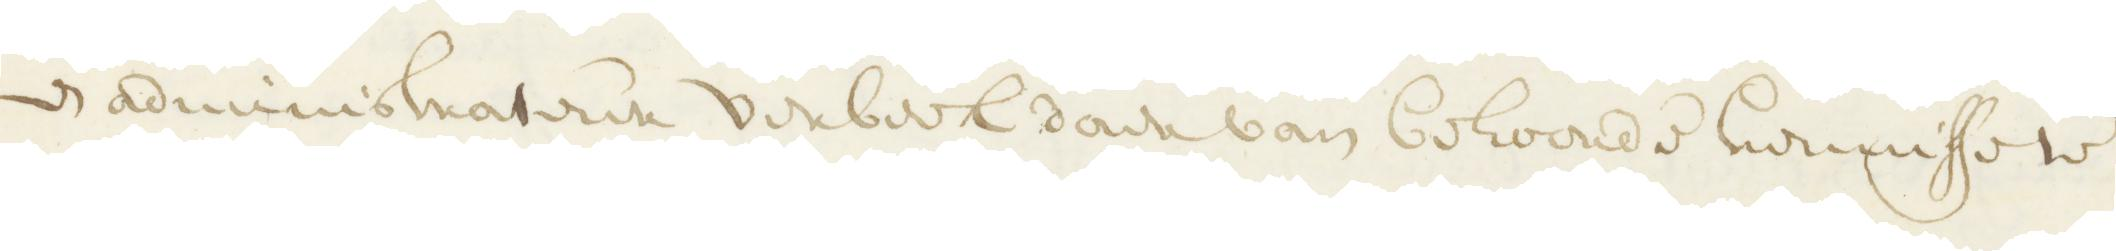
en administrateur verbeek daer van behoorde kennisse te
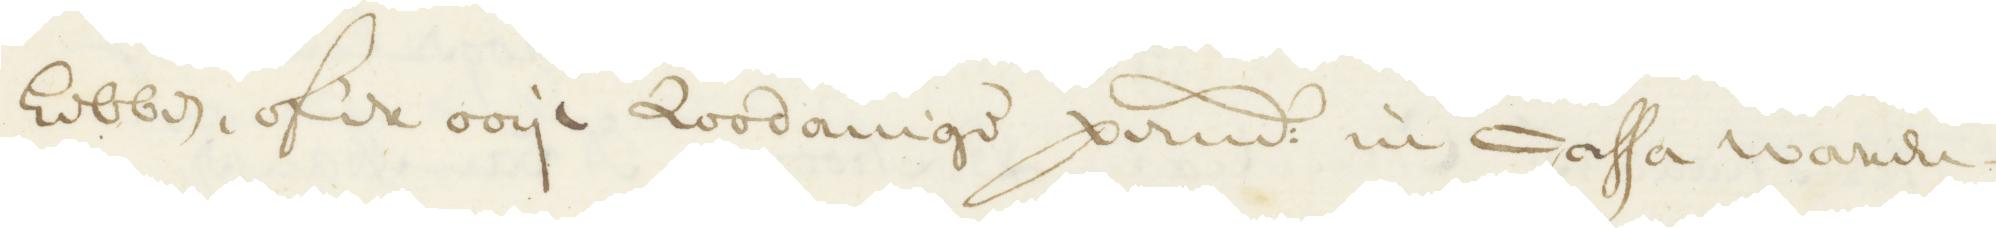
hebben, of er ooijt zoodanige penn: in cassa waren
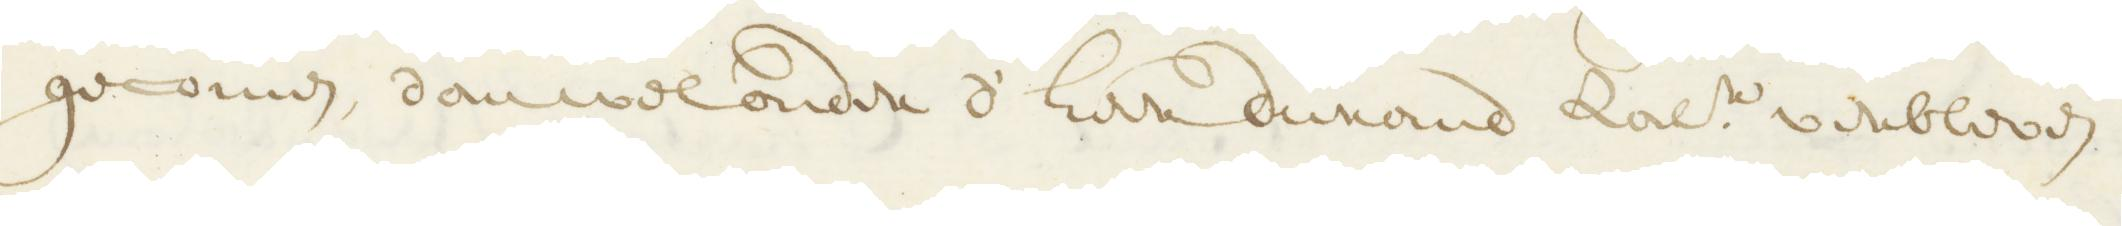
gecomen, dan wel onder d’ heer durand zal:r verbleven
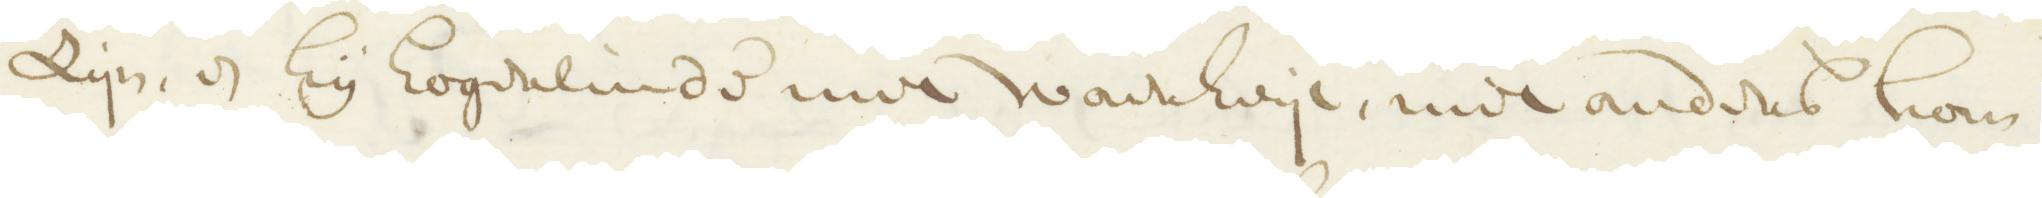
zijn, en hij hogerlinde met waerheijt, niet anders kan
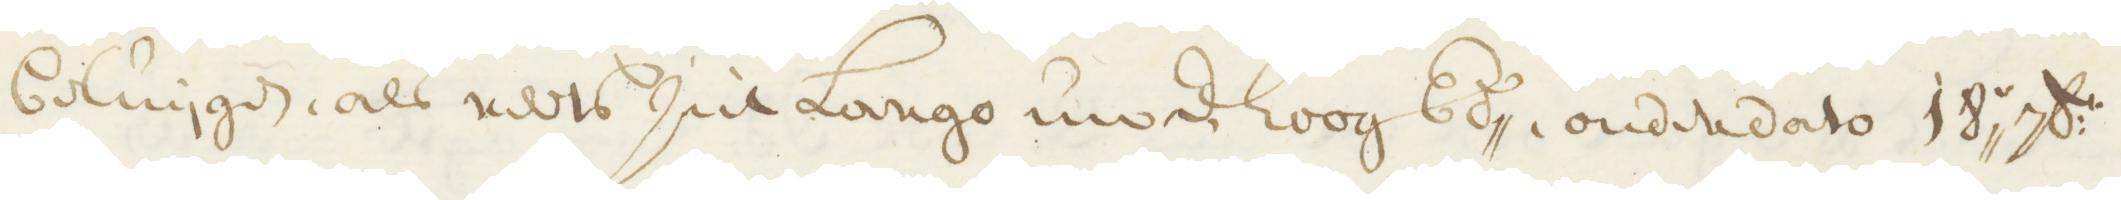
betuijgen, als reets jn't Largo uw E hoog Ed„ onder dato 18„e 7b:r
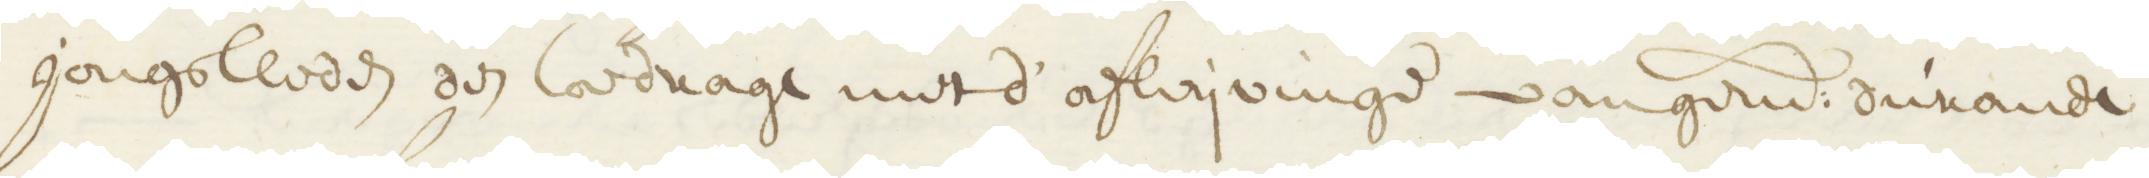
jongstleden den toedragt met d’ afleijvinge van gem: durandt
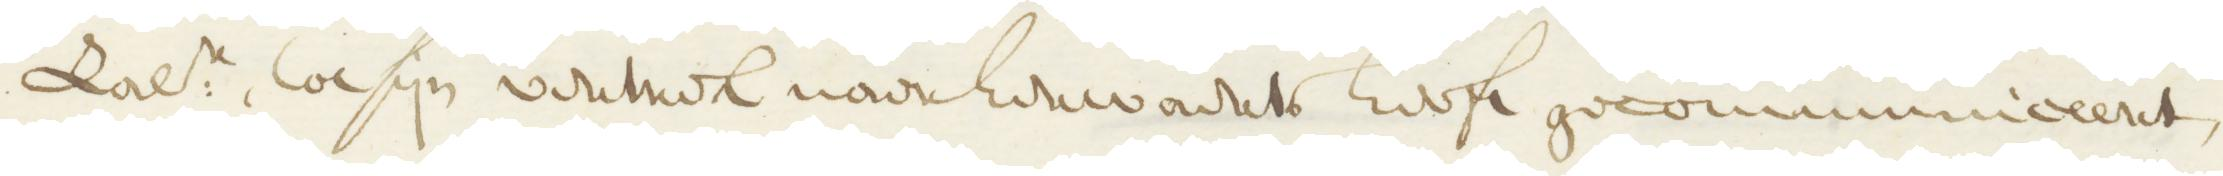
zal:r tot sijn vertrek naer herwaerts heeft gecommuniceert,
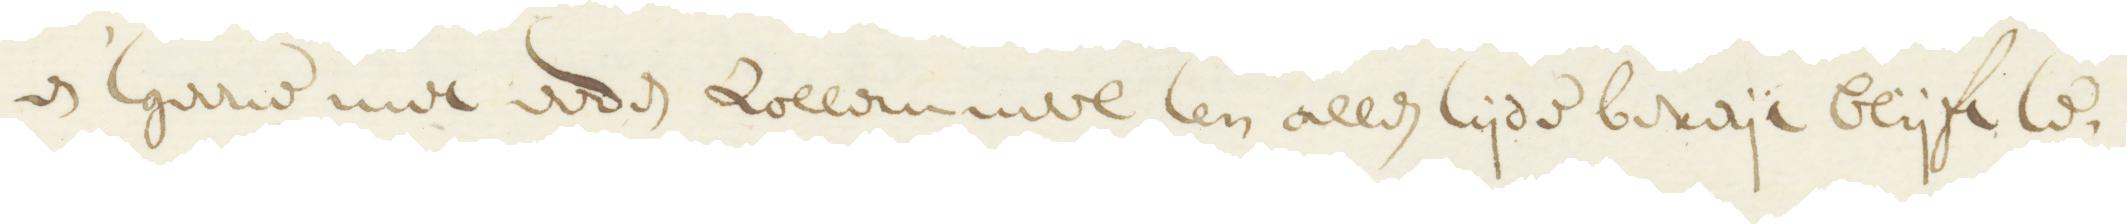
en 'tgeene met eeden zollemneel ten allen tijde bereijt blijft te„
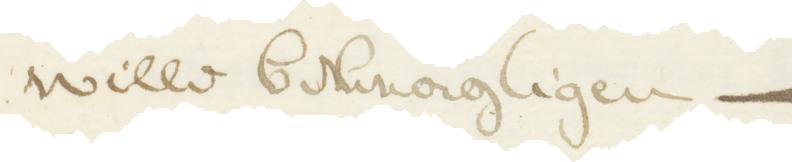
wille bekragtigen —
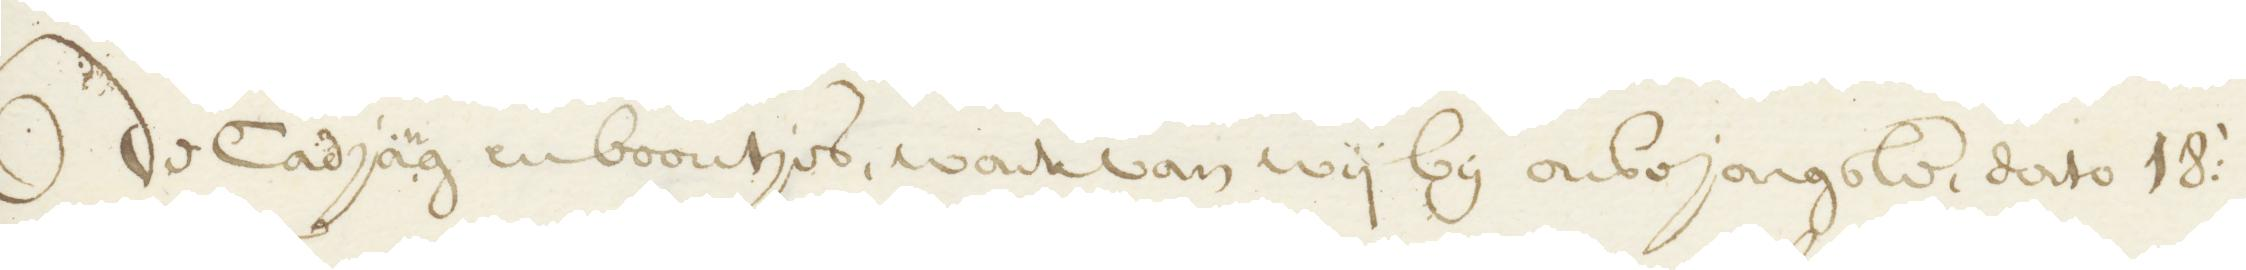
de Cadjang enboontjes, waer van wij bij onsejongste, dato 18:'
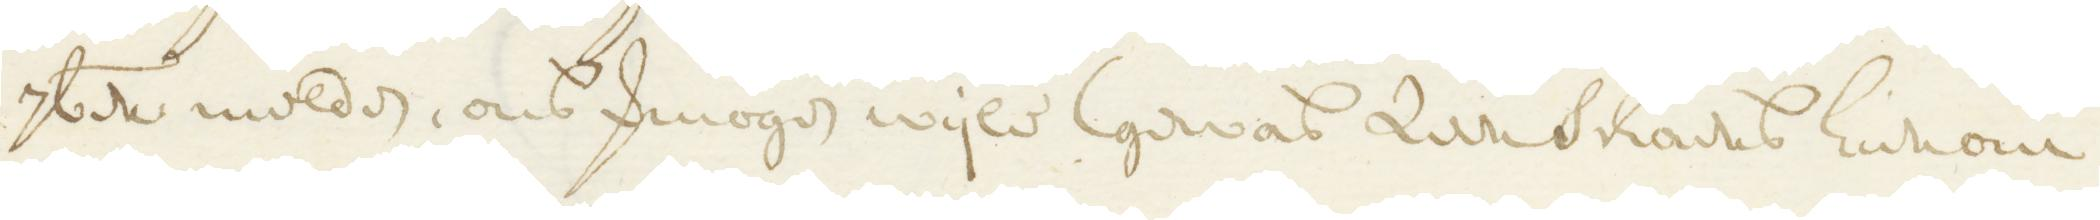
7ber melden, ons vermogen wijle 't gewas zeer schaers hier om
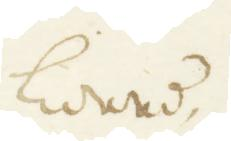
herre,
